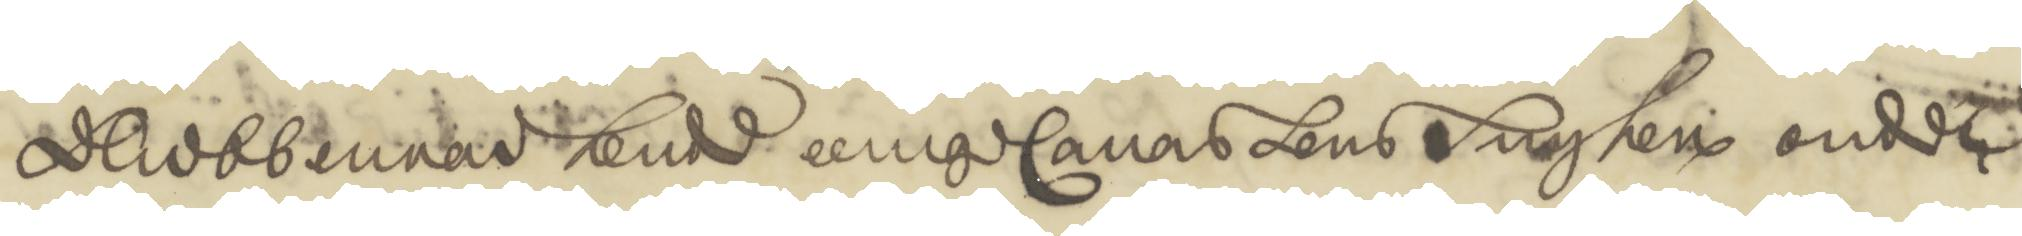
te hebben raekende eenige Canassers Suyker onder
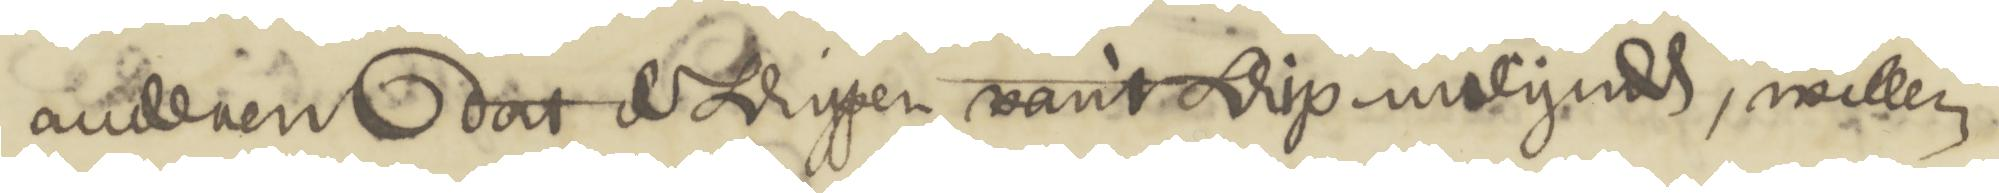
anderen dat de schipper van’t schip meijnden, willem
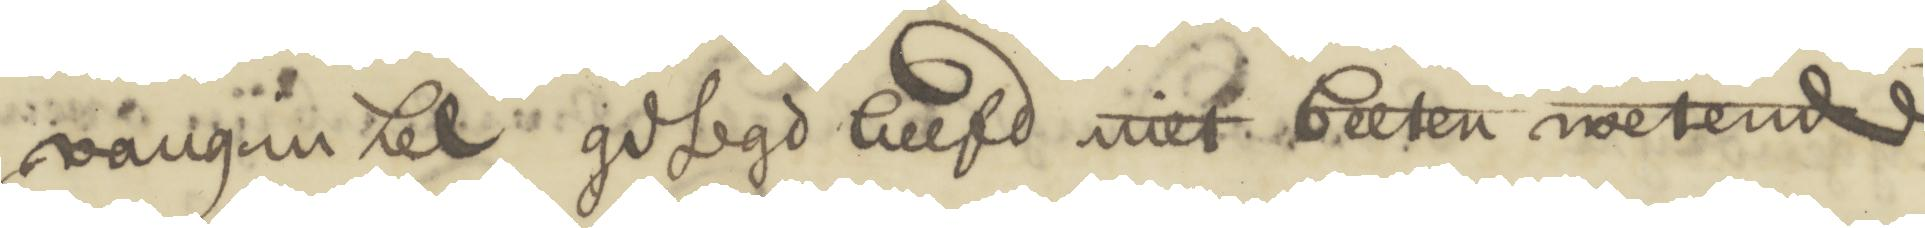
vanginkel gesegd heefd niet beeter wetende
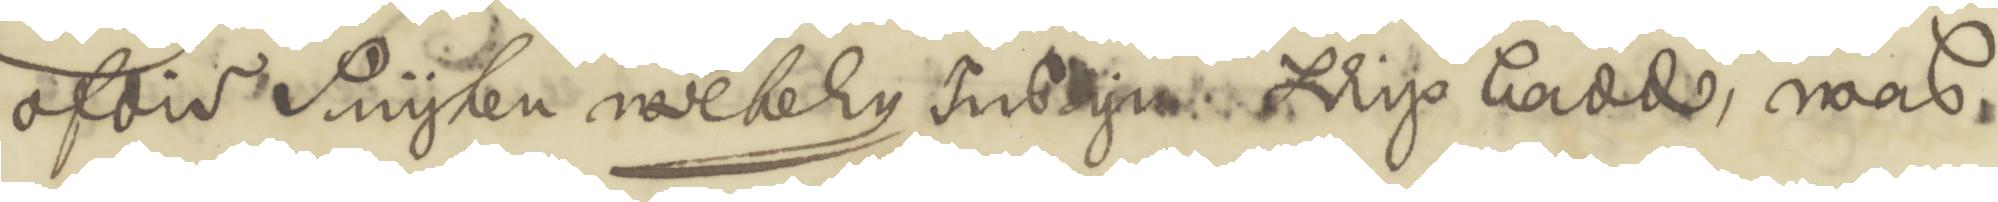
of die Suijker welke hy In Sijn: Schip hadde, was,
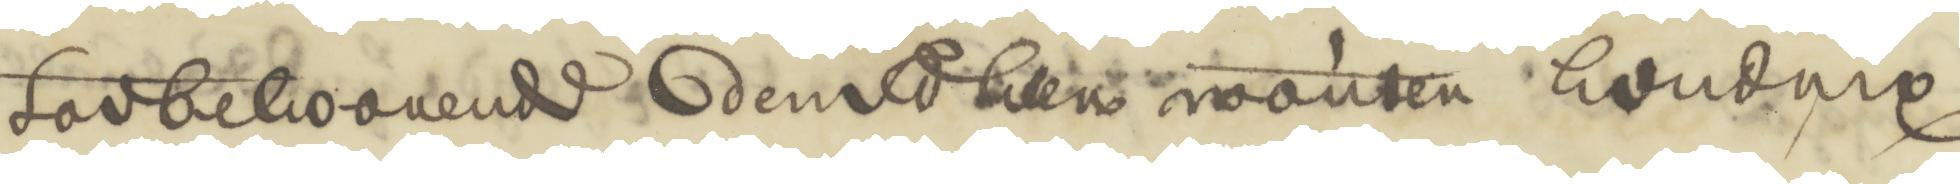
toebehoorende den Ed heer wouter hendrix
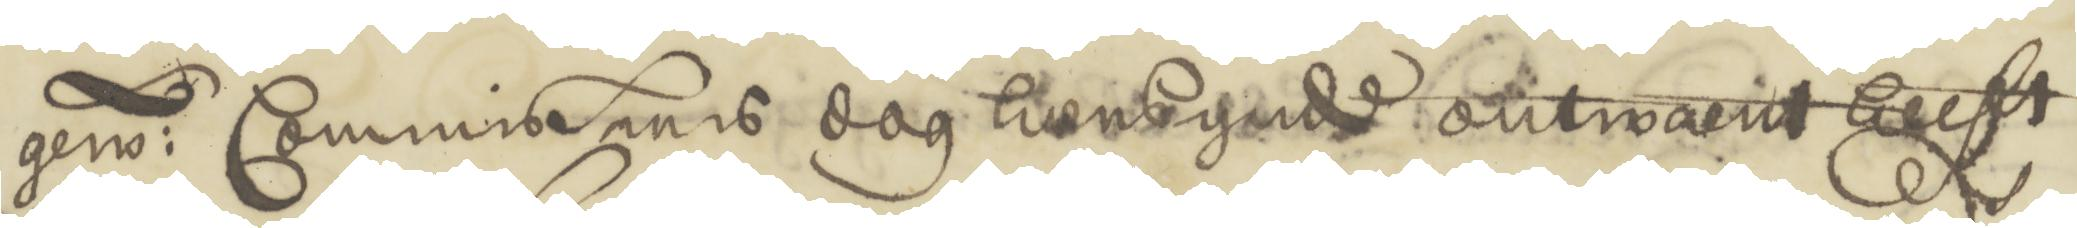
gew: Commisseris dog hier synde ontwaert heeft
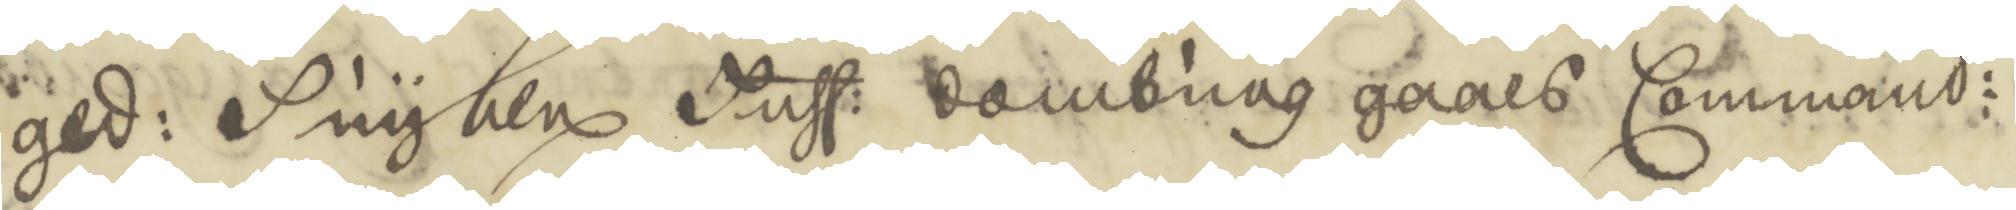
ged: Suijker Iuff: domburg gaals Command:s
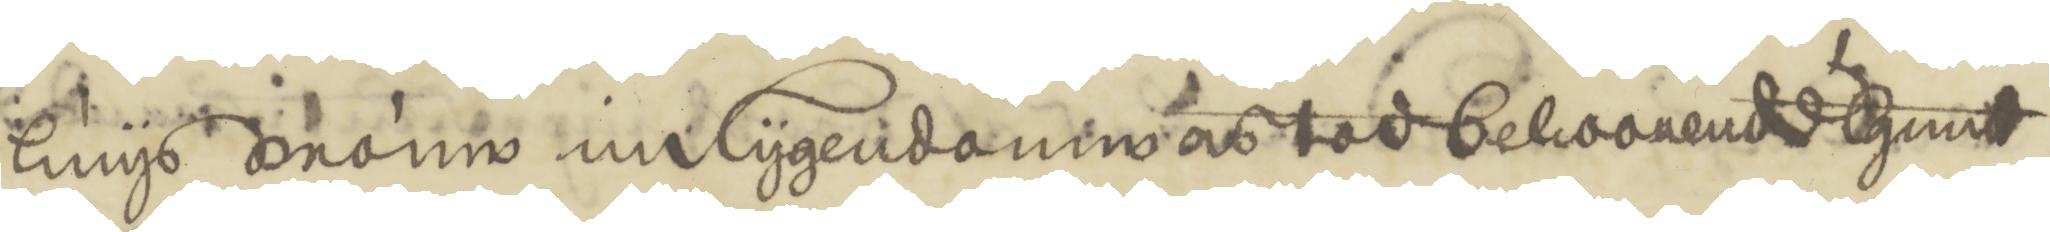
huijs vrouw in Eijgendom was toe behoorende 't Gunt
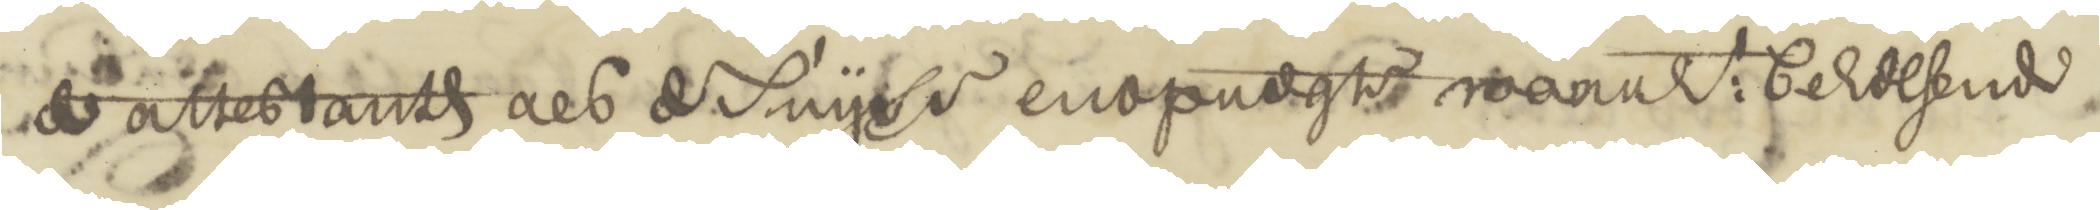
de attestanten als de suijvere en opregte waarh:t behelsende
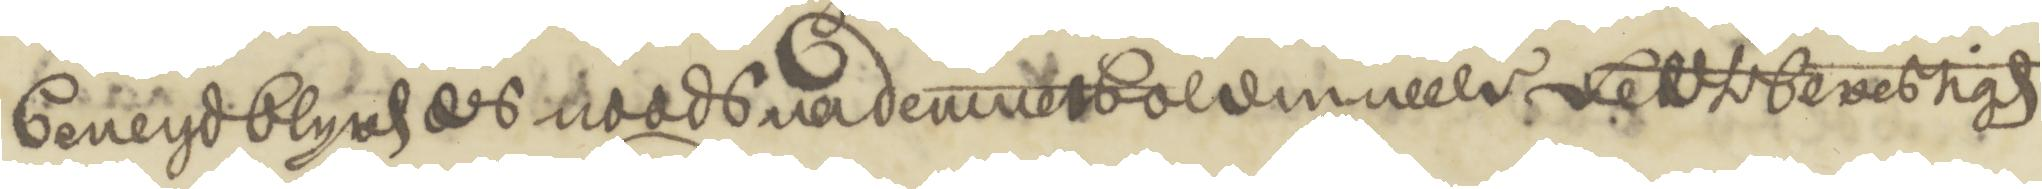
bereyd blyven des noods nader met solemneele eede te bevestigen
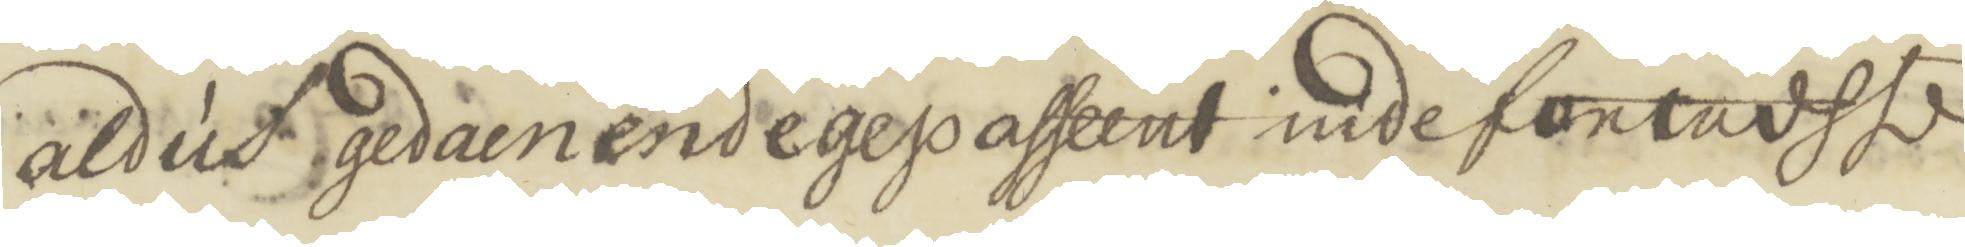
aldus gedaen ende gepasseert inde fortresse
